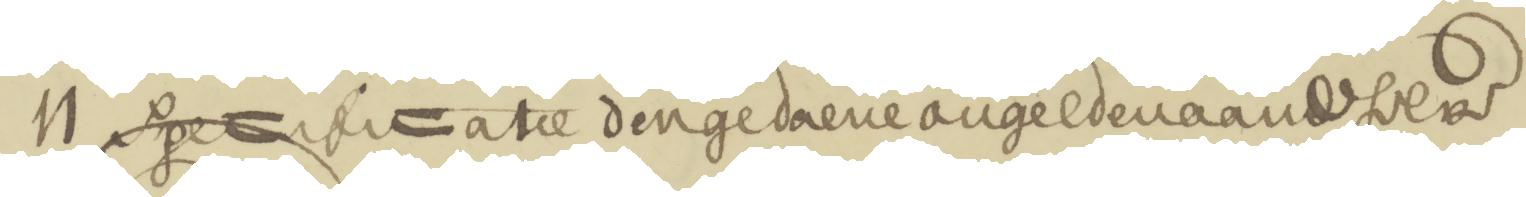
11 specificatie den gedaene ongelden aan deselve
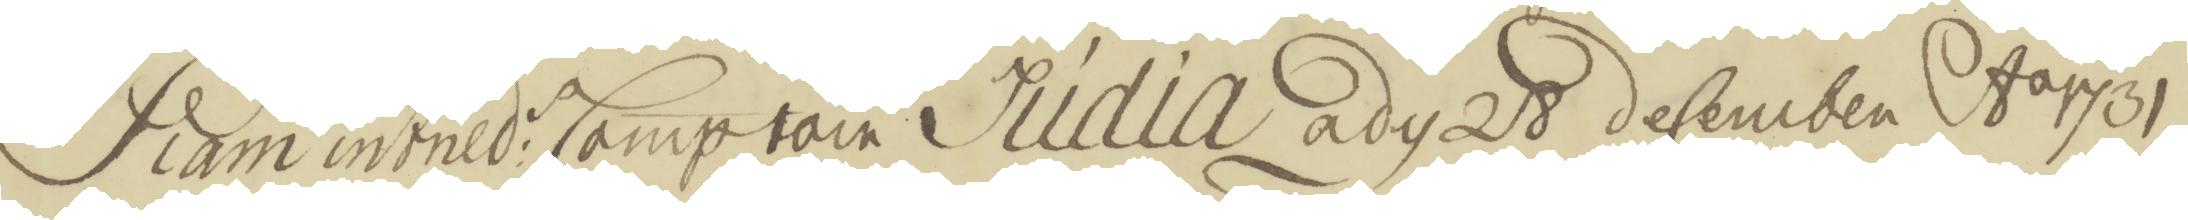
Siam in 't ned:s Comptoir India ady 28 december A:o 1731
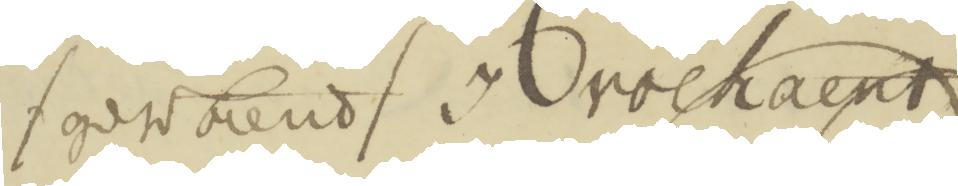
/getekend/ I volkaert
